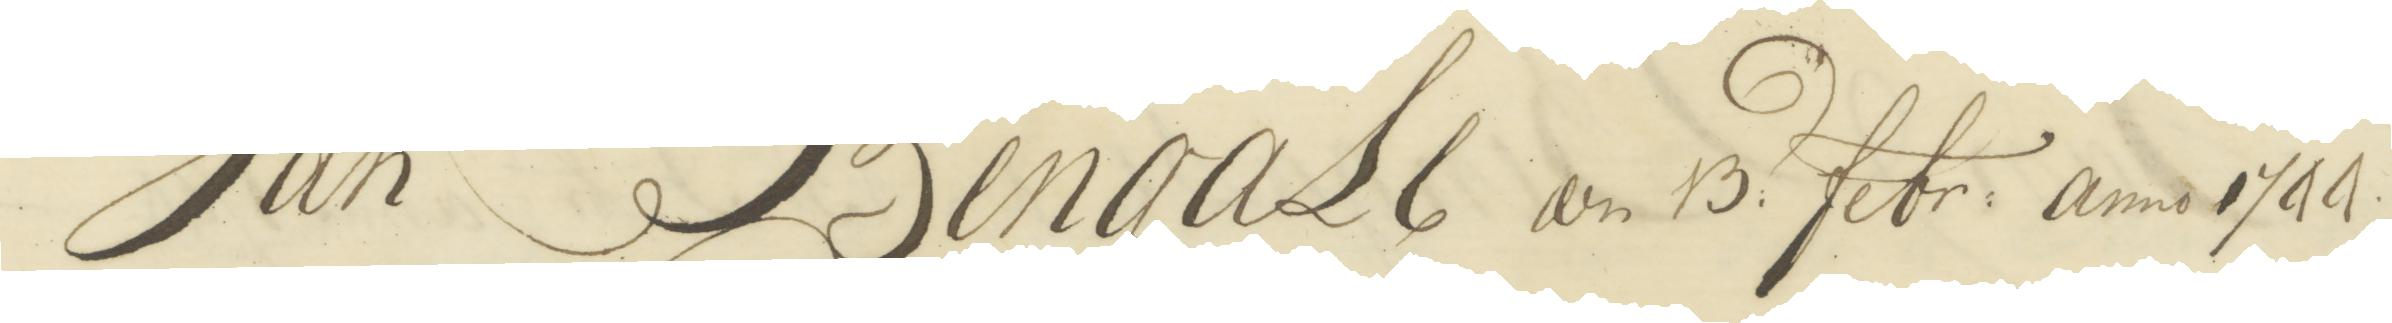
Van Bengale den 13:en febr: anno 1744.
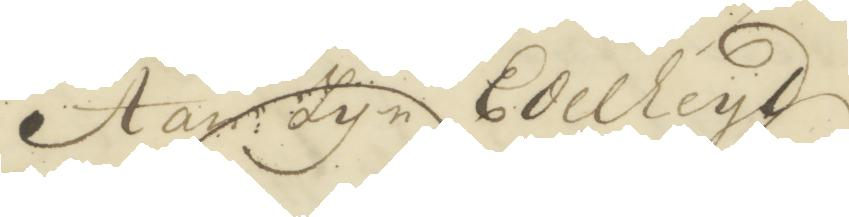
Aan Zijn Edelheijd
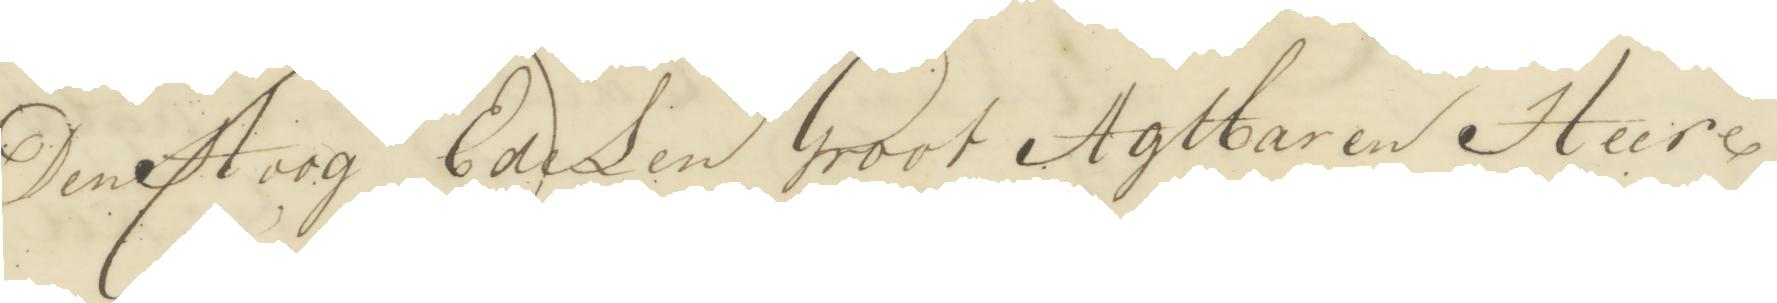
Den Hoog Edelen Groot Agtbaren Heere
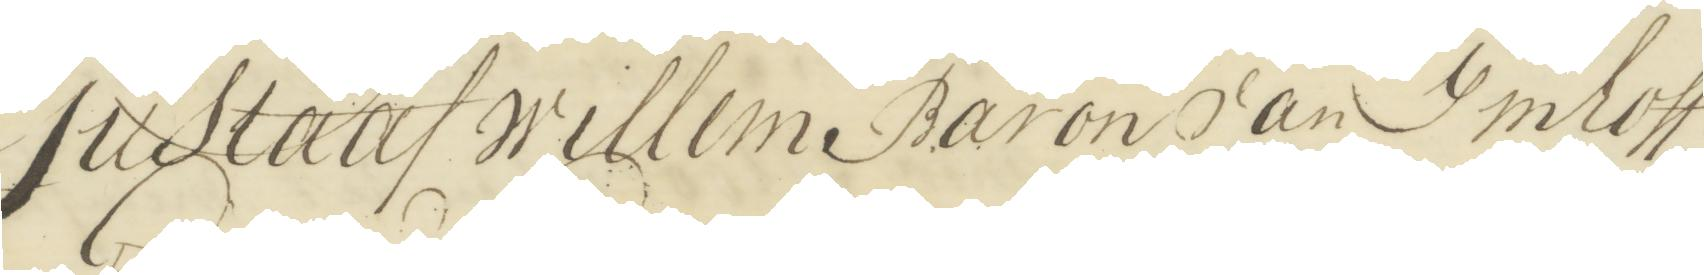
Gustaaf Willem Baron van Imhoff
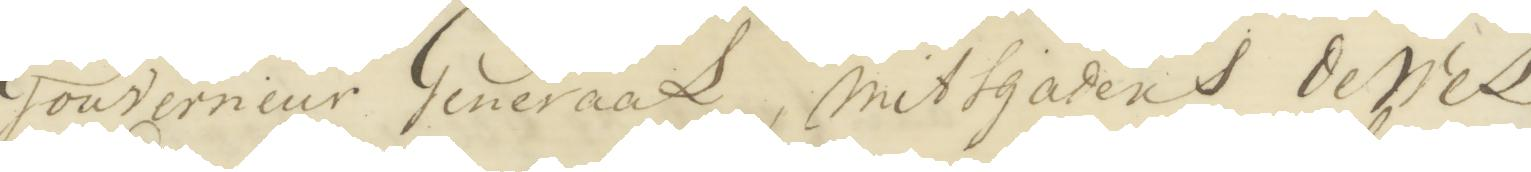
Gouverneur Generaal, mitsgaders de Wel
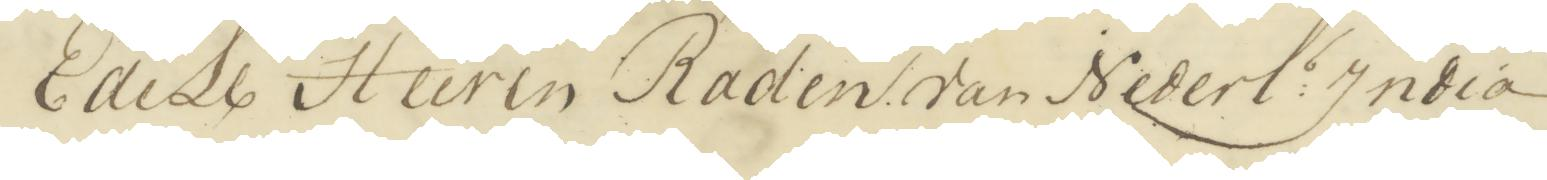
Edele Heeren Raden van Nederl:s Jndia.
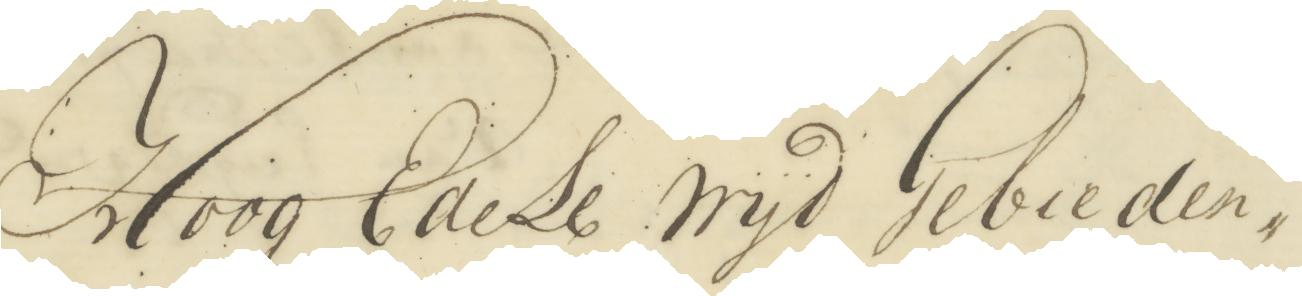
Hoog Edele wijd Gebieden„
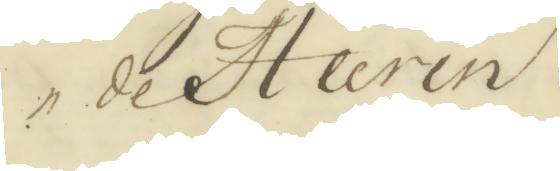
„de Heeren
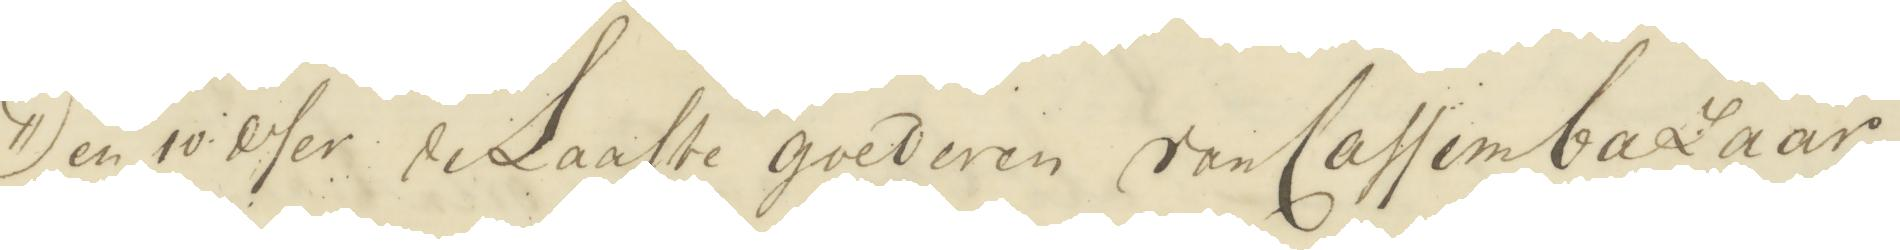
Den 10: deser de Laaste goederen van Cassembazaar
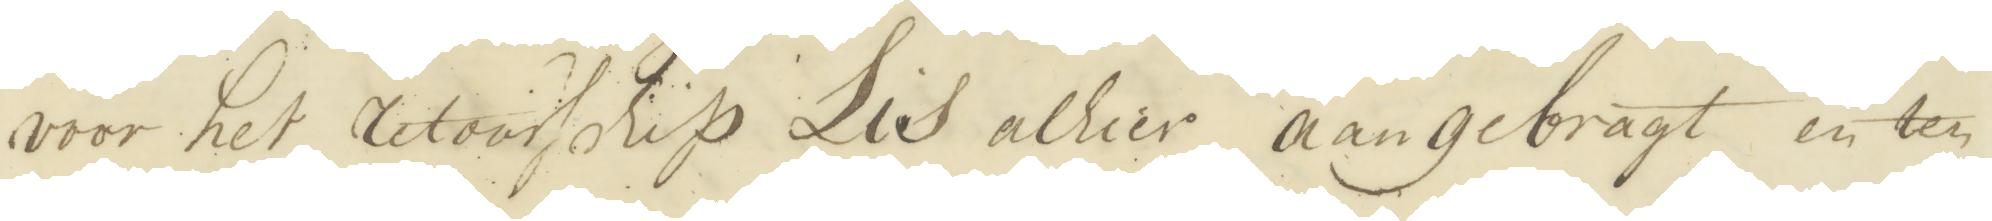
voor het retourschip Lis alhier aangebragt en ten
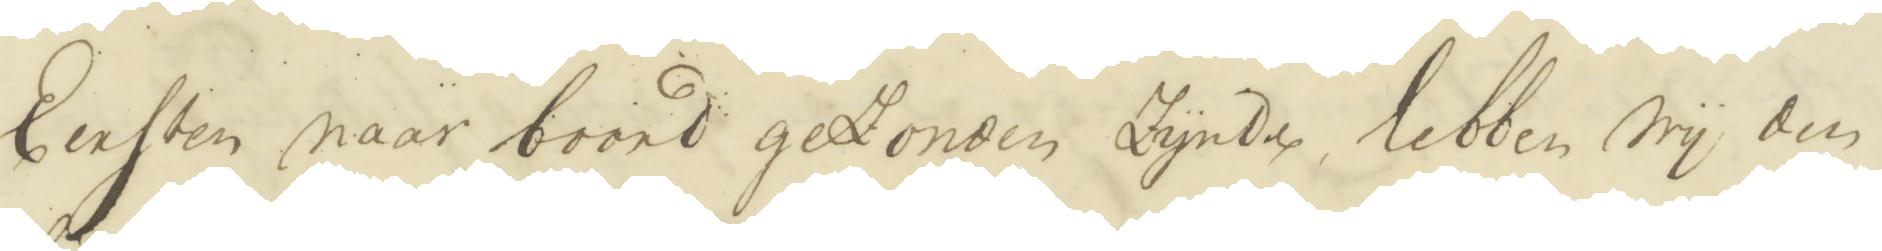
Eersten naar boord gezonden Zijnde, hebben wij den
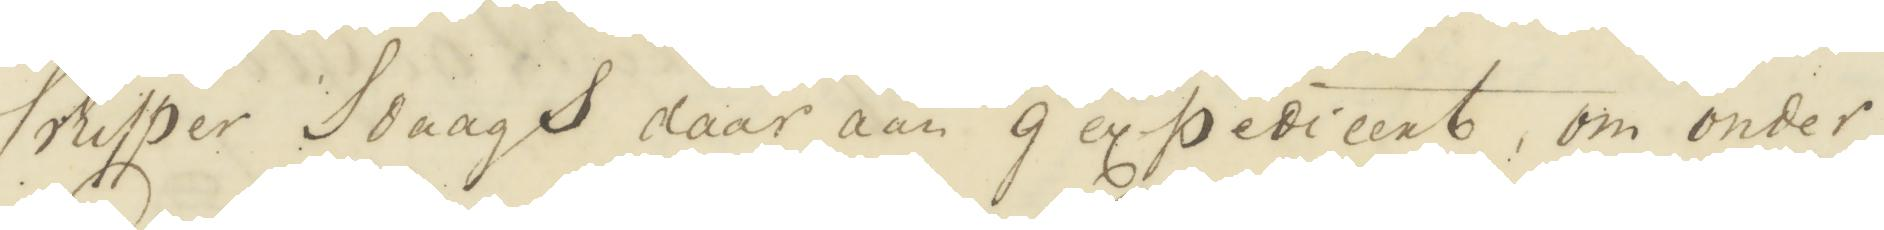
Schipper 'S daags daar aan g' expedieert, om onder
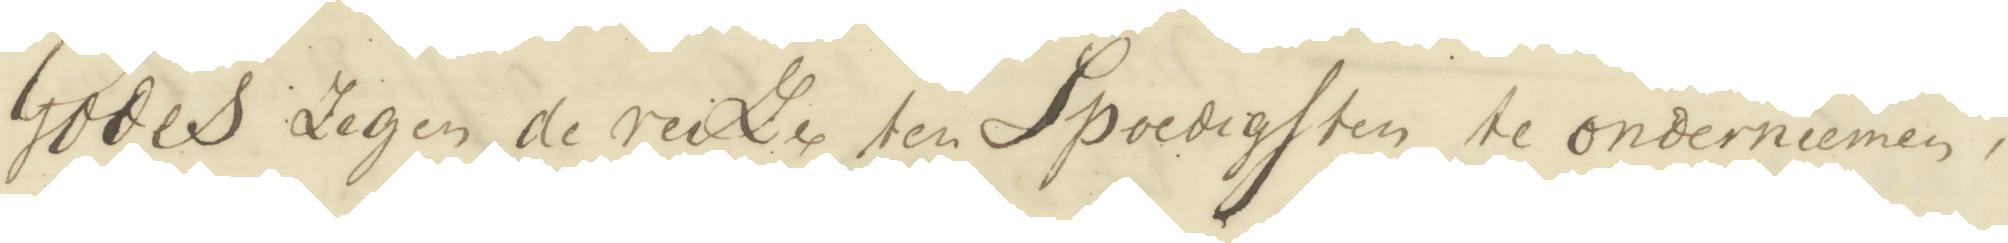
Godes Zegen de reize ten Spoedigsten te onderneemen,
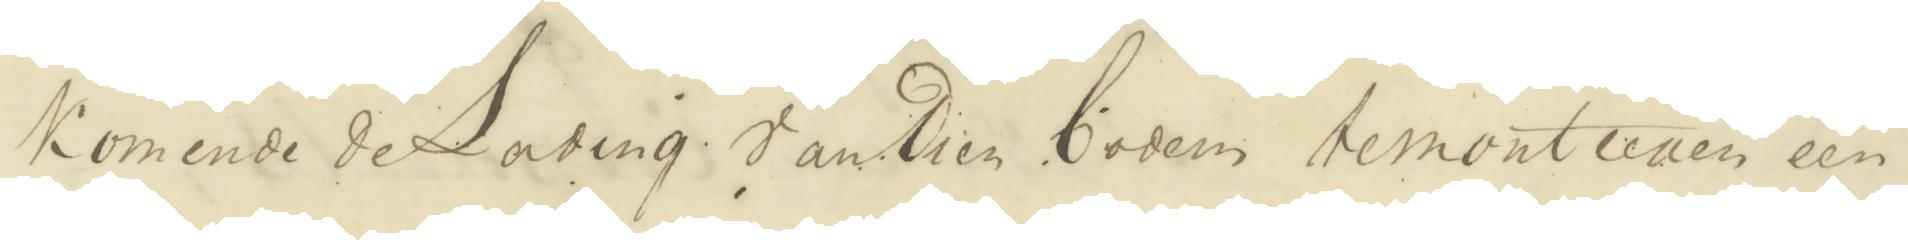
Komende de Lading van dien bodem te monteeren een
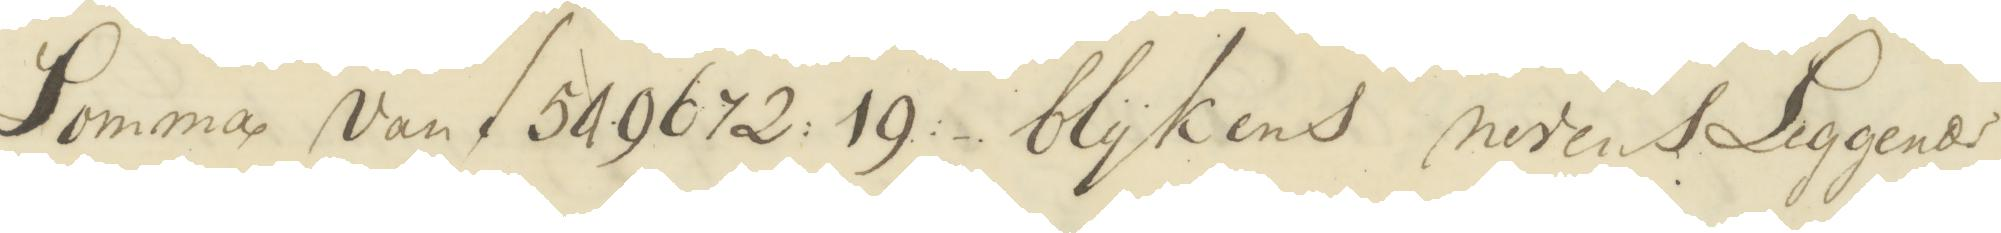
Somma van ƒ549672: 19: — blijkens nevens Liggende
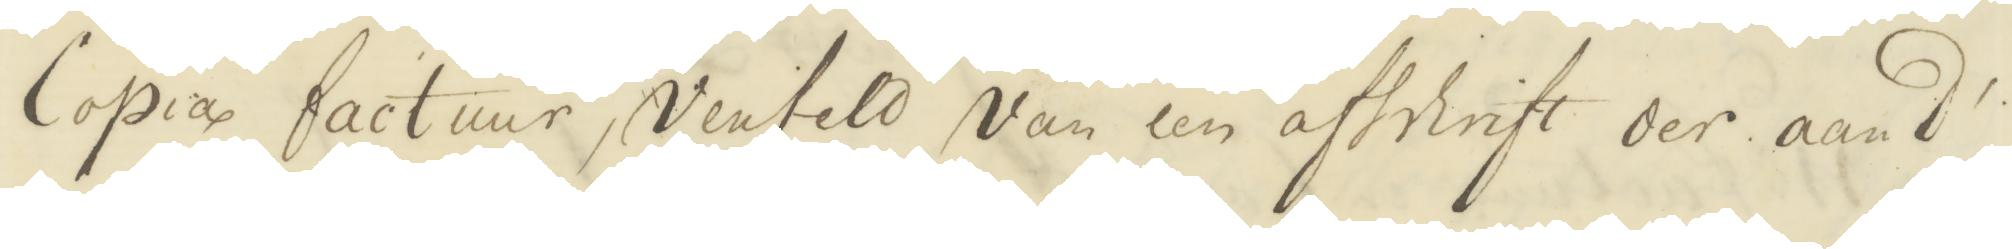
Copia factuur, verseld van een afschrift der aan d'
